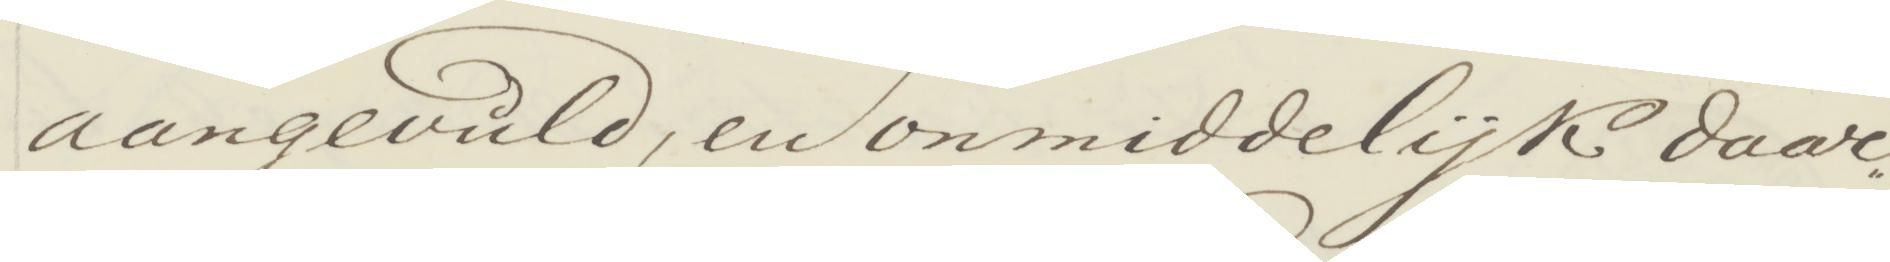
aangevuld, en onmiddelijk daar„
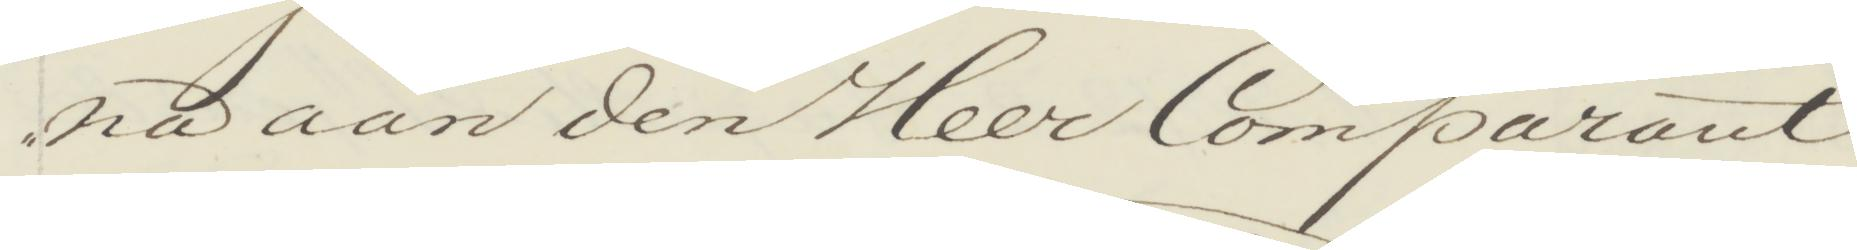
„na aan den Heer Comparant
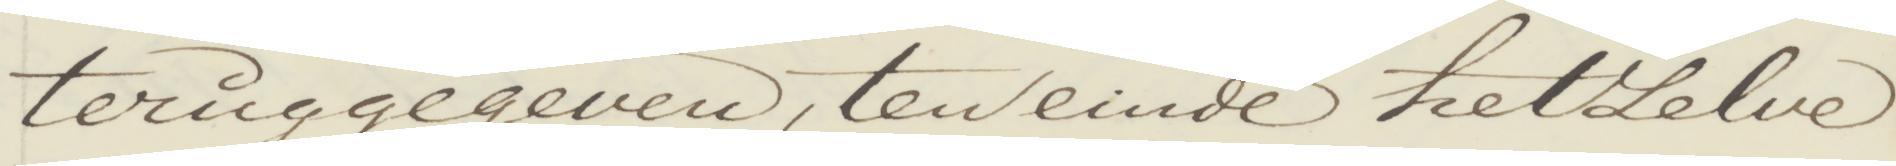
teruggegeven, ten einde hetzelve
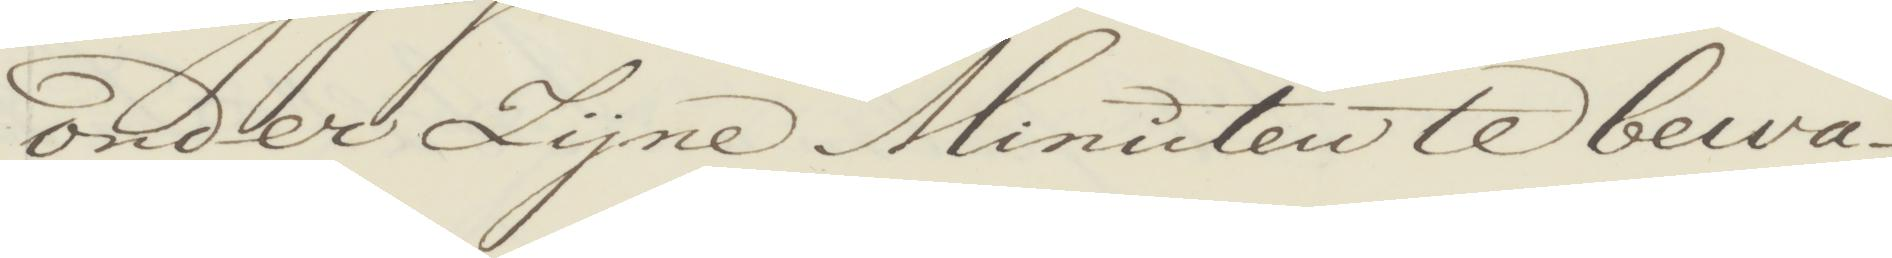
onder Zijne Minuten te bewa„
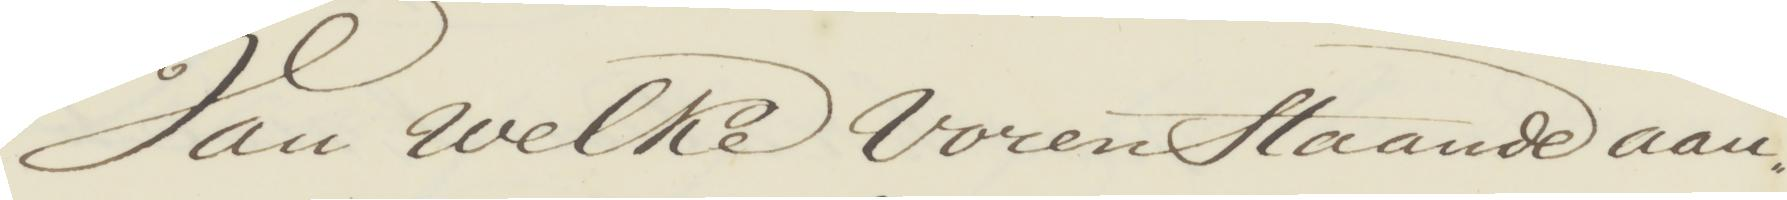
Van welke voren Staande aan„
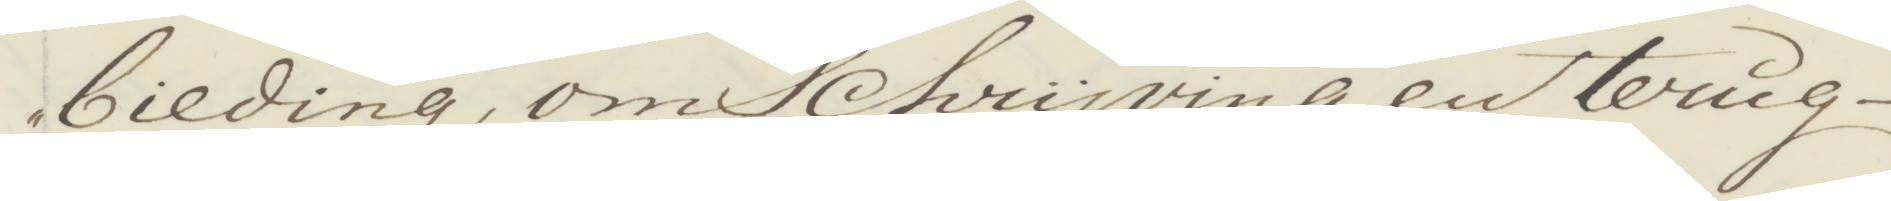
„bieding, omschrijving en terug=
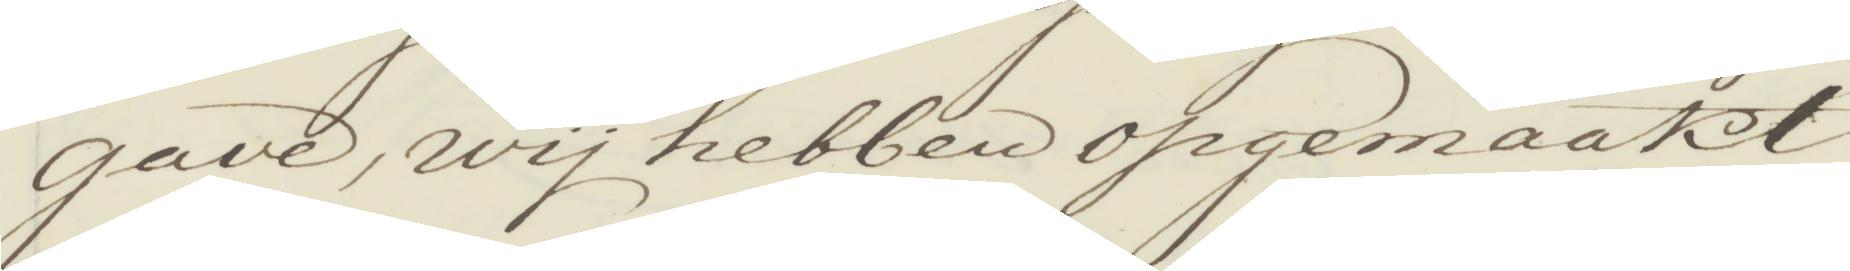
gave, wij hebben opgemaakt
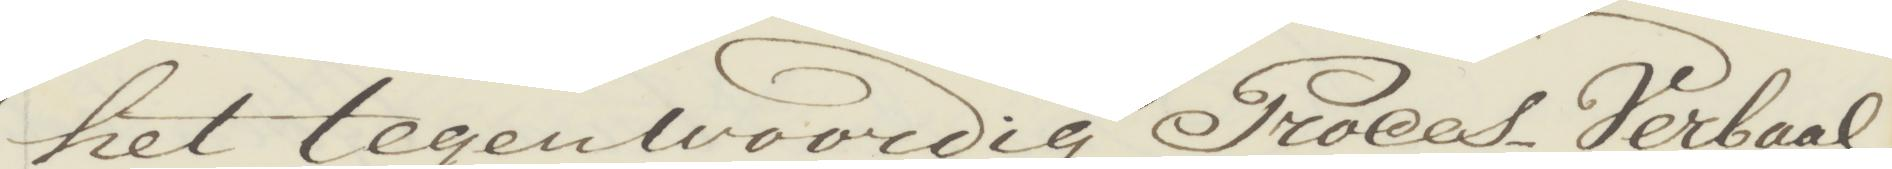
het tegenwoordig Proces- Verbaal
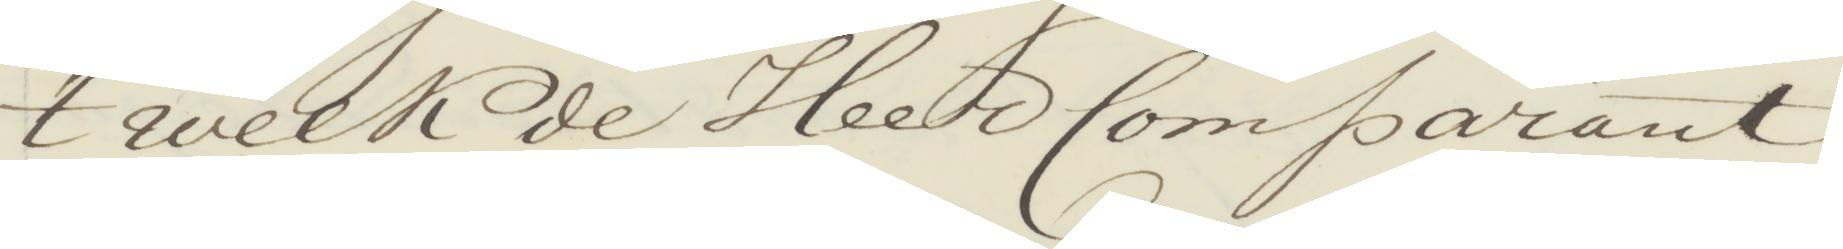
’t welk de Heer Comparant
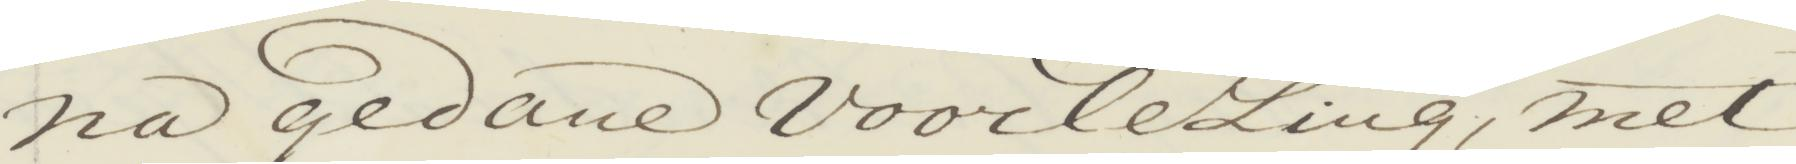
na gedane voorlezing, met
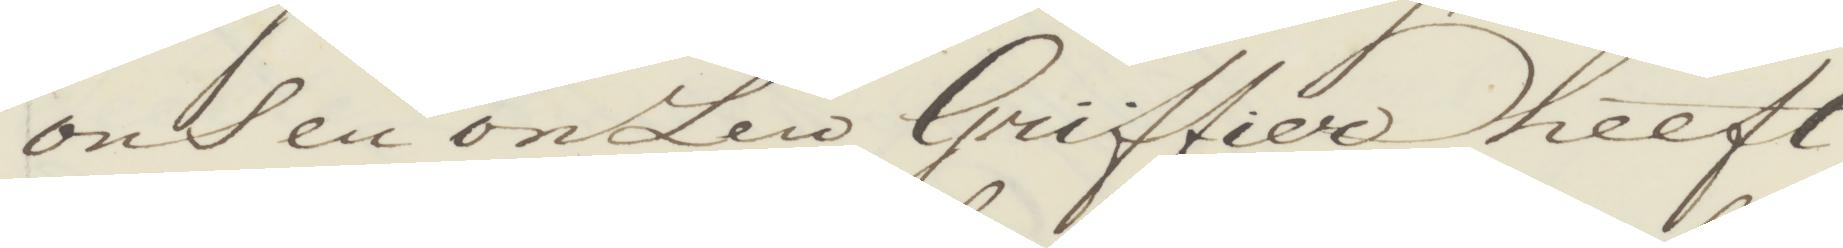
ons en onzen Griffier heeft
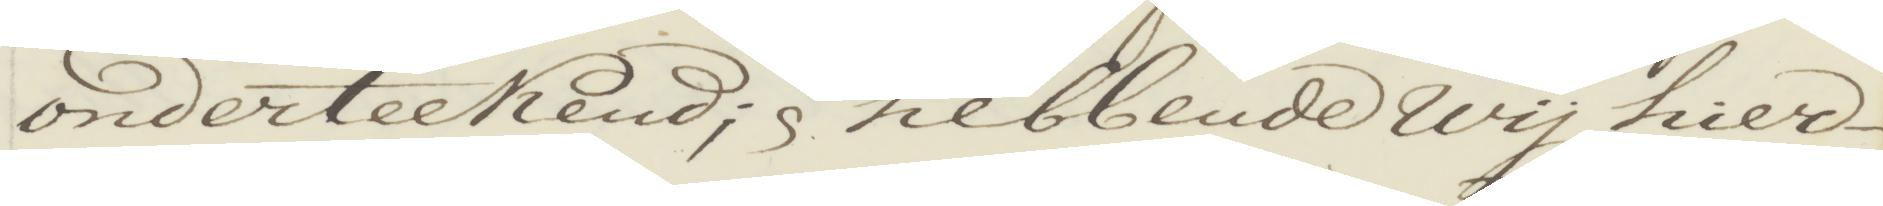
onderteekend; hebbende wij hier
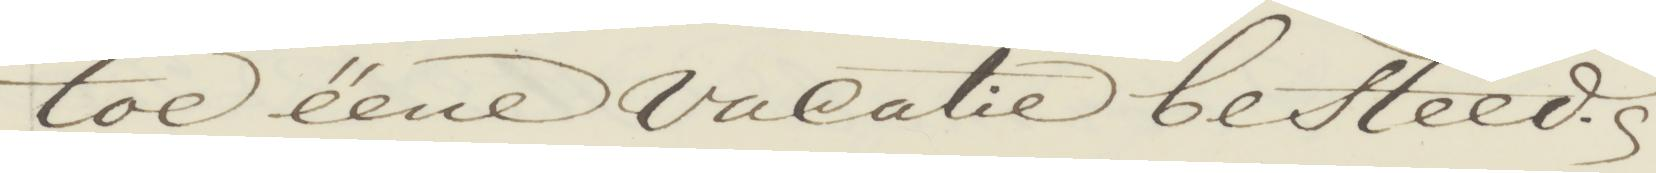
toe ééne vacatie besteed.~
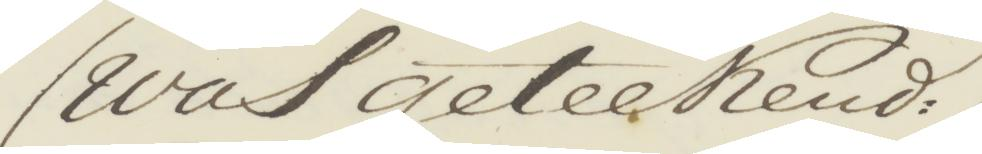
(was geteekend.)
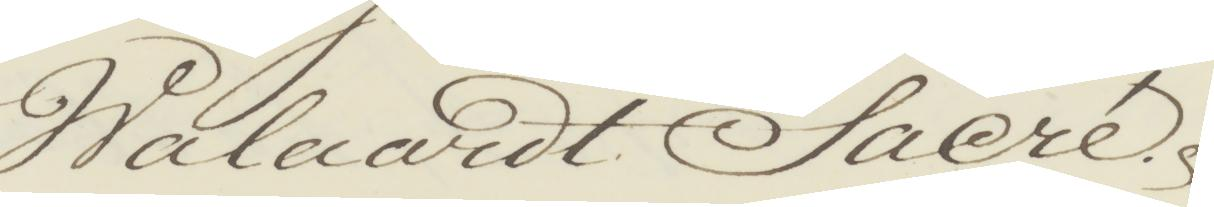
Walaardt Sacré.~
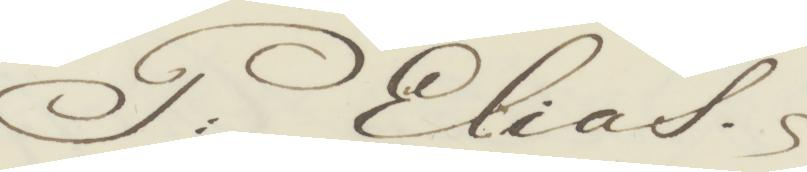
P: Elias.~
